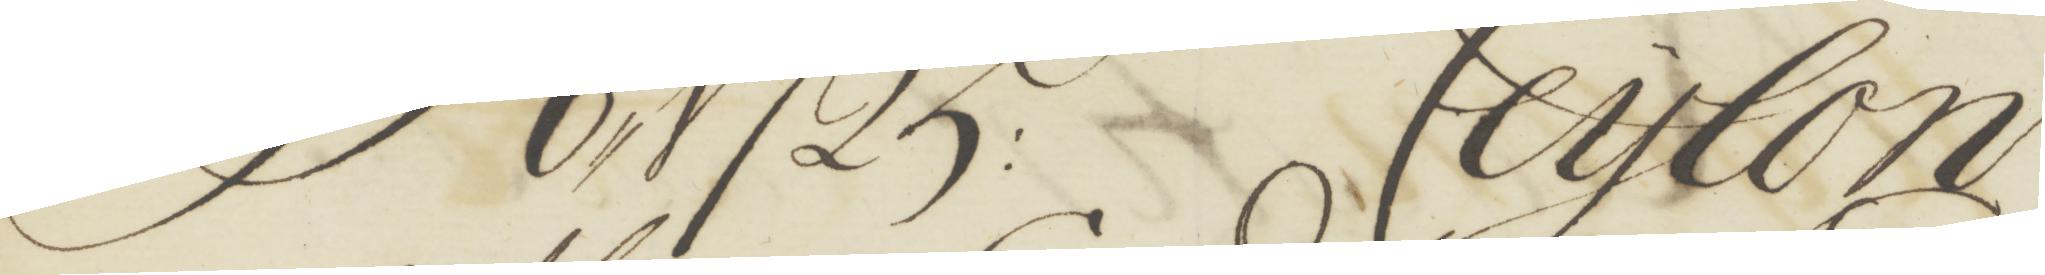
A„o 1725: Ceijlon
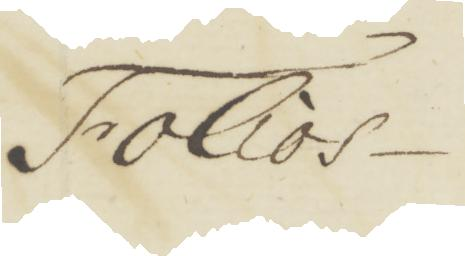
Folios—
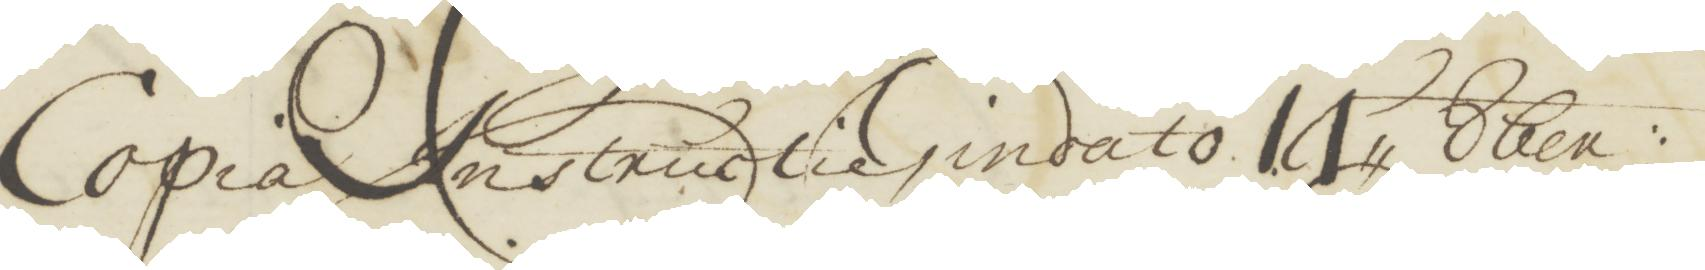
Copia Instructies in dato 14„e 8ber:
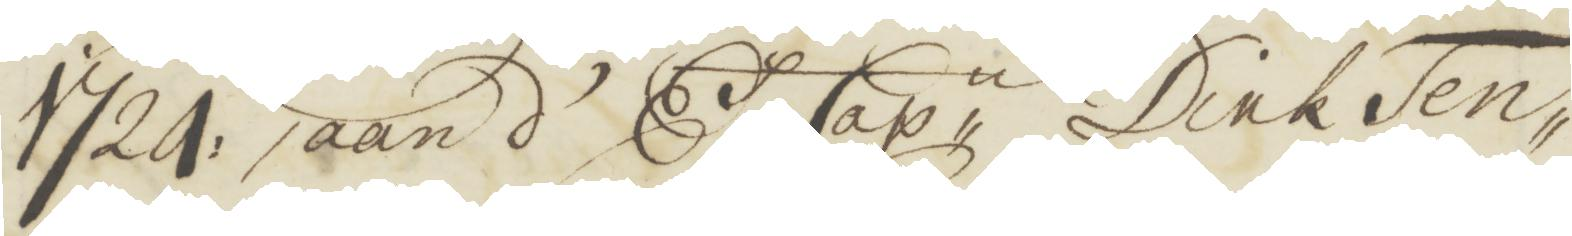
1724: aan d’ E„s Cap„n Dirk Ten„
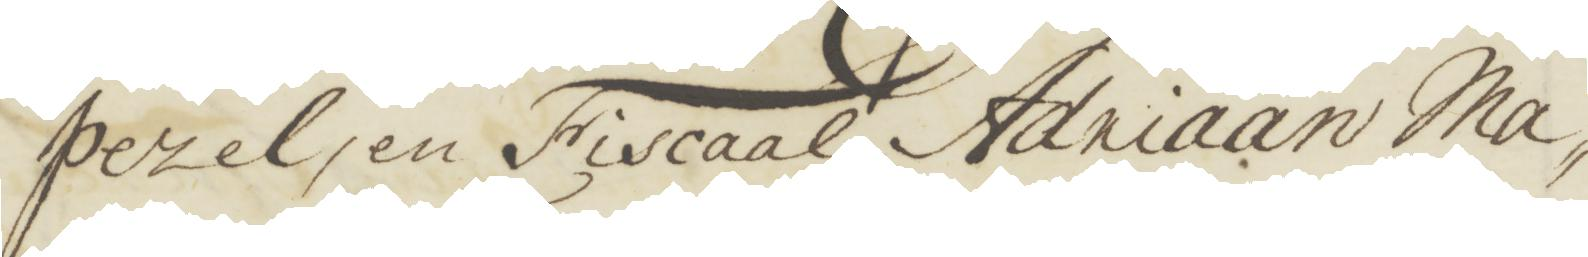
pezel, en Fiscaal Adriaan Ma„
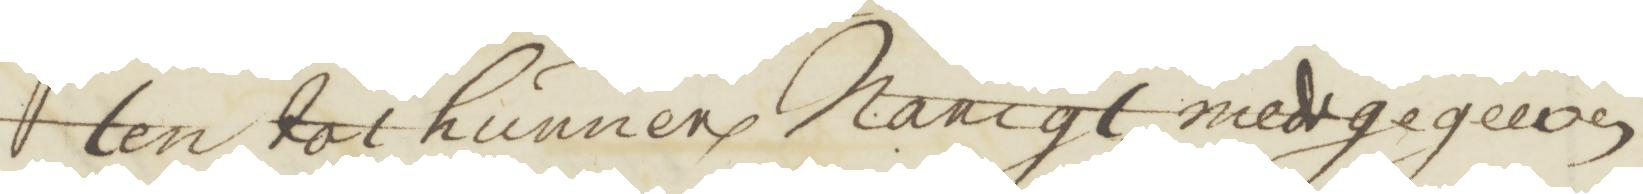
ten tot hunner Narigt medegegeeven
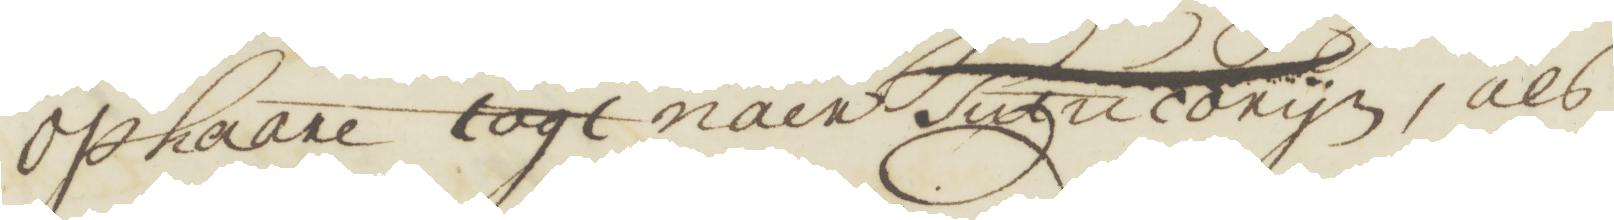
op haare togt naer Tutucorijn, als
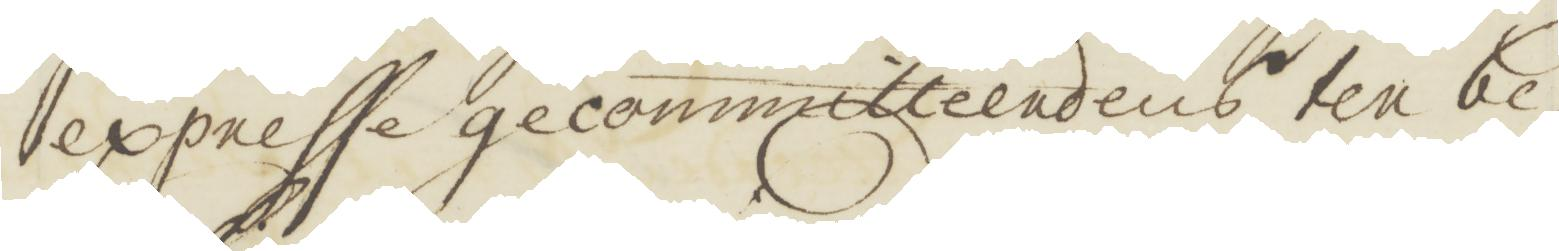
expresse gecommitteerdens ter be
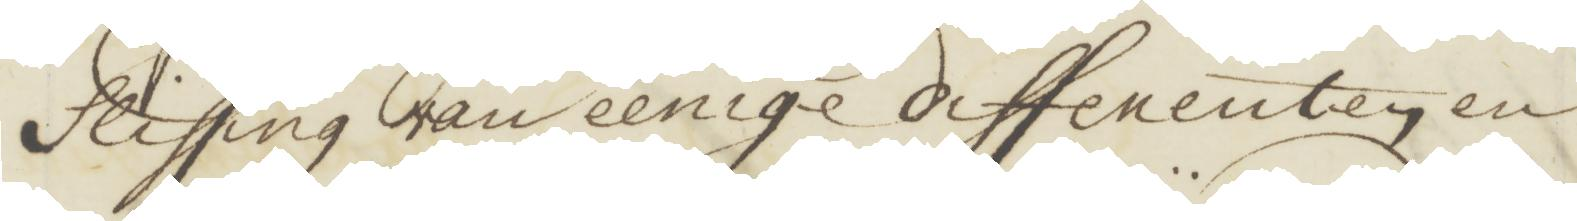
slissing van eenige differenten en
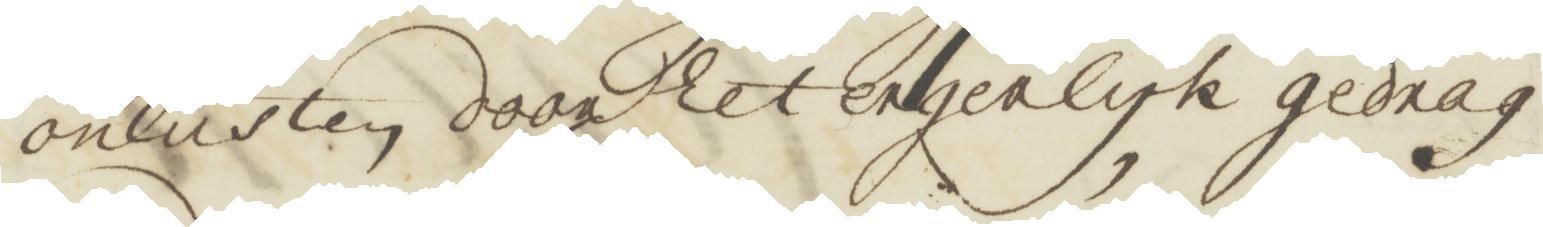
onlusten door het ergerlijk gedrag
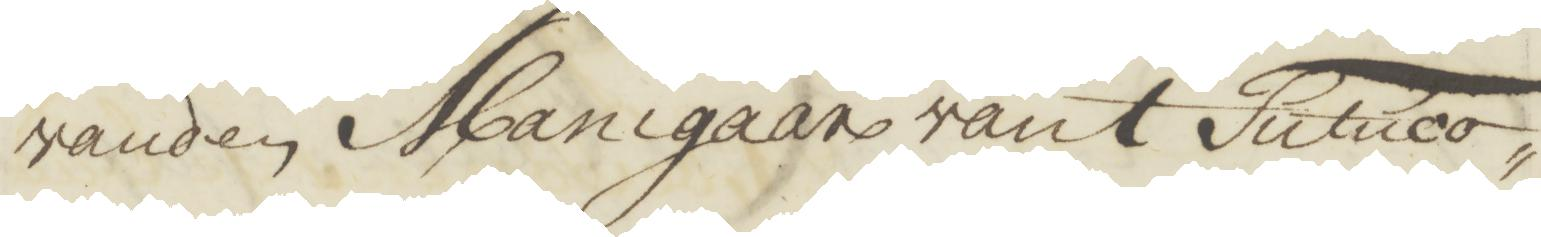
vanden Manigaar van ’t Tutuco„
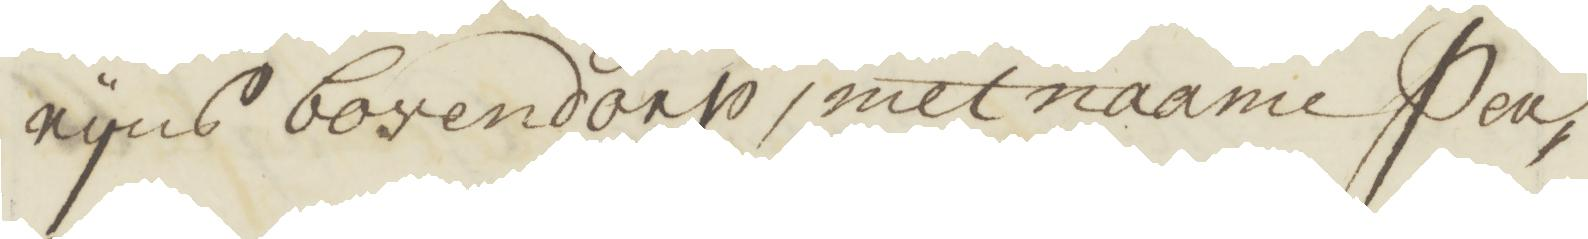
rijns bovendorp, met naame Per„
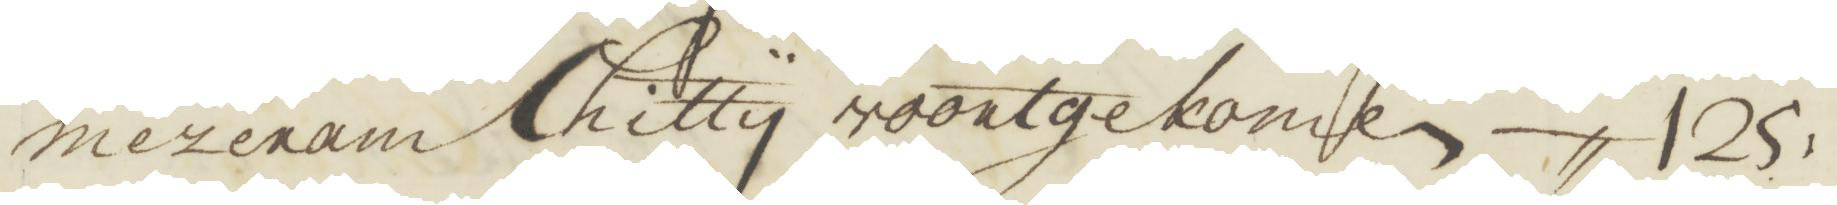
mezeram Chittij voortgekomen — „ 125:
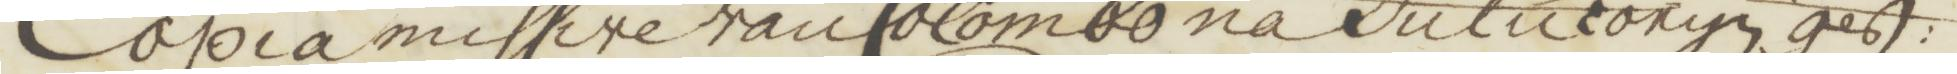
Copia missive van Colombo na Tutucorijn ges:
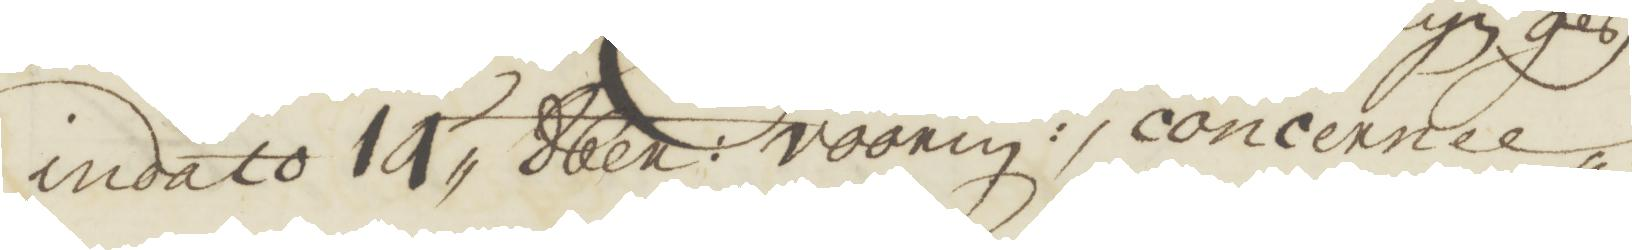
in dato 14„e 8ber: voorm:, concernee
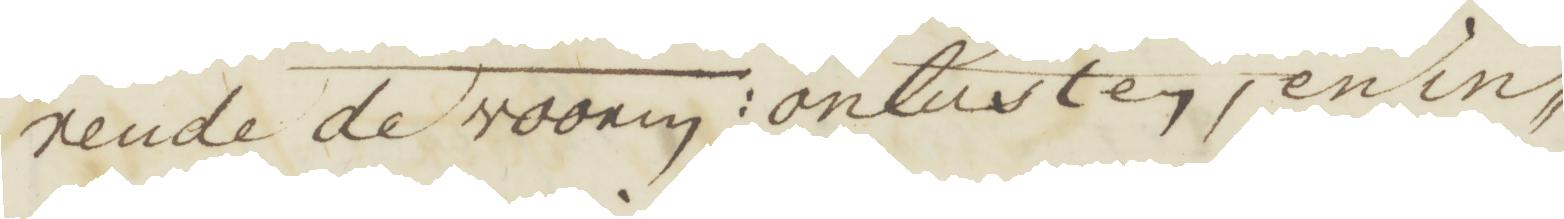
rende de voorm: onlusten, en in
